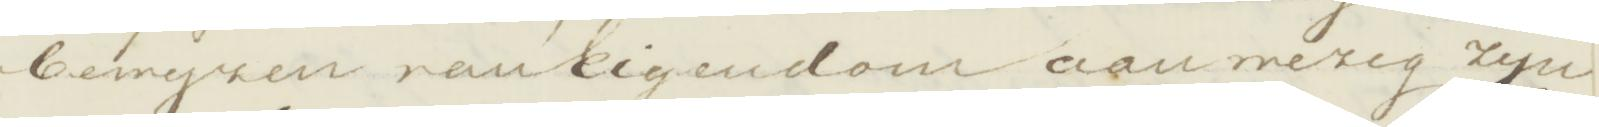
bewyzen van Eigendom aanwezig zyn
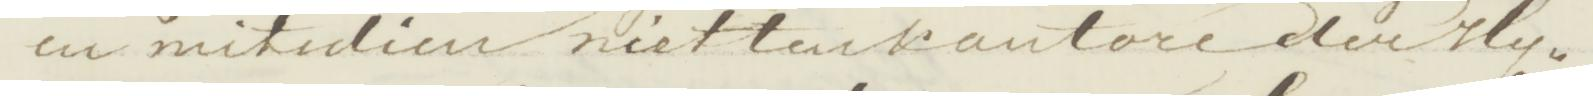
en mitsdien niet ten kantore der Hy„
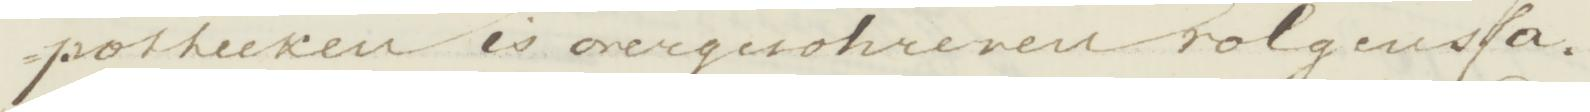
=potheeken is overgeschreven volgens Ca.
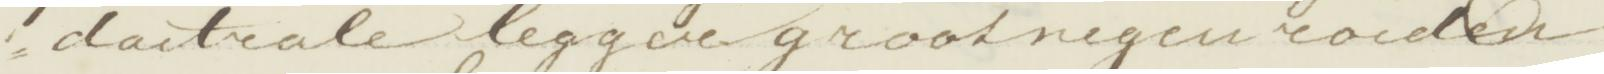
=dastrale legger groot negen roeden
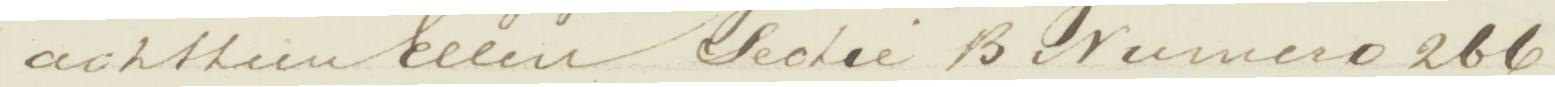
achttien Ellen Sectie B Numero 266
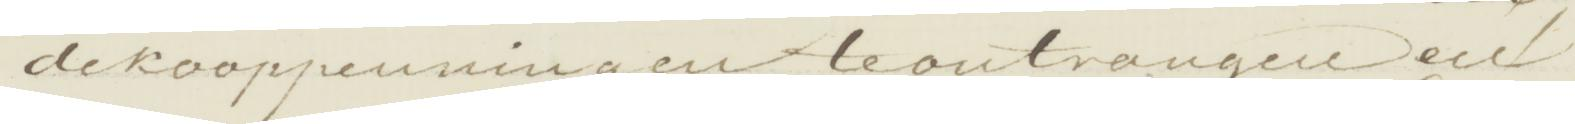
de kooppenningen te ontvangen en
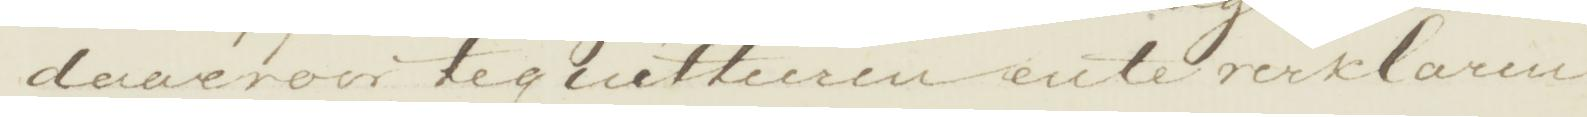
daarvoor te quitteeren en te verklaren
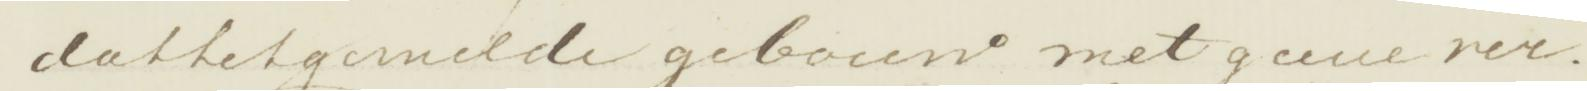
dat het gemelde gebouw met geene ver.
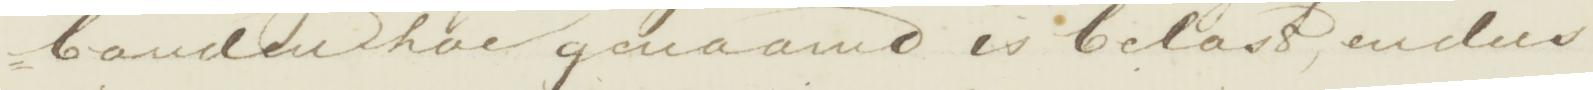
„banden hoe genaamd is belast, en dus
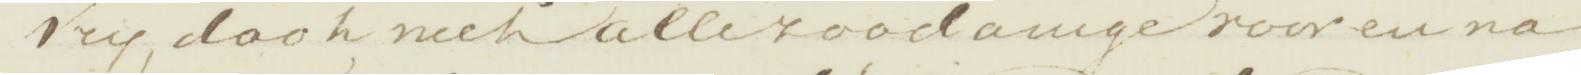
Vry, doch niet alle zoodanige voor en na
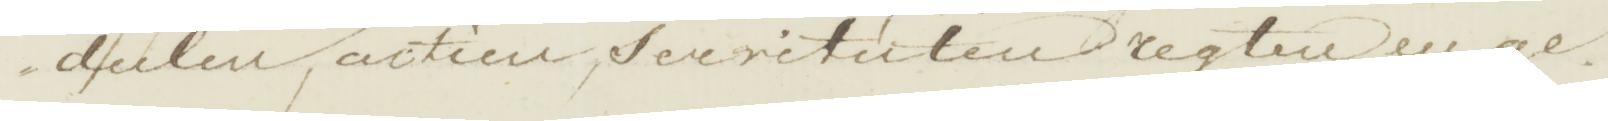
„deelen, actien, servituten regten en ge.
